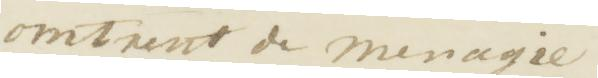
omtrent de menagie
